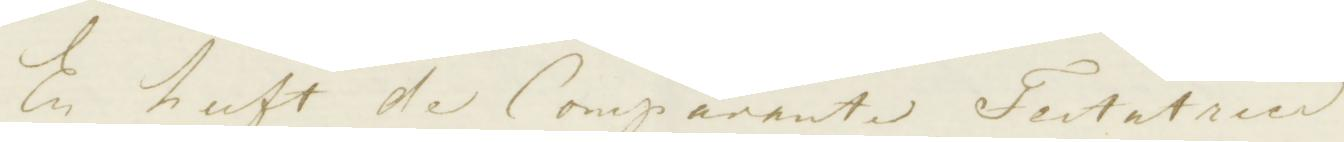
En heeft de Comparante Testatrice
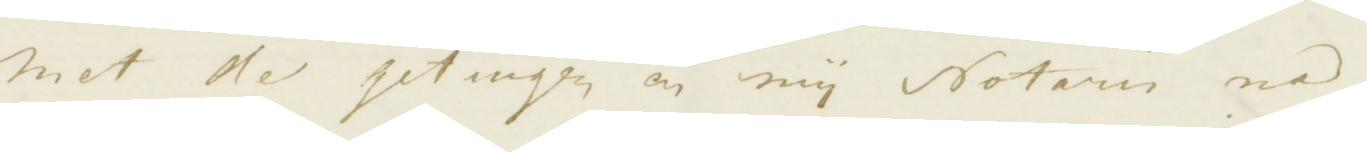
met de getuigen en mij Notaris na
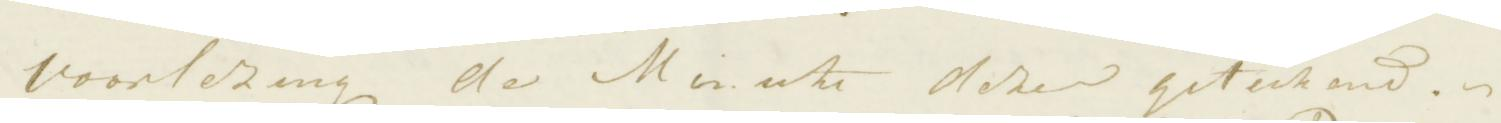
voorlezing de Minute deze geteekend.
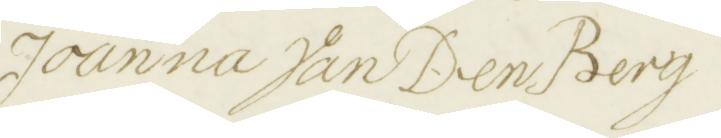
Joanna Van Den Berg
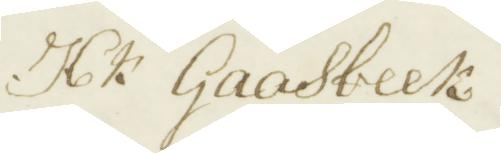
Hk Gaasbeek
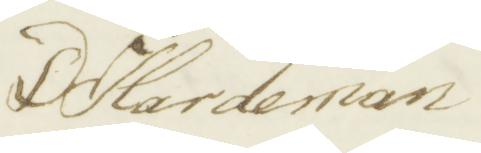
D Hardeman
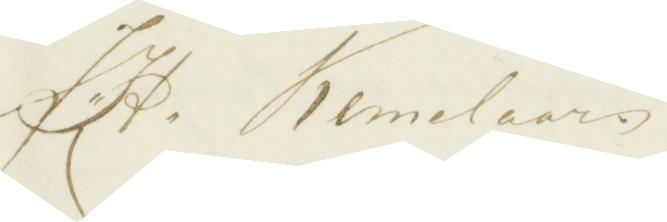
JH. Kemelaars
